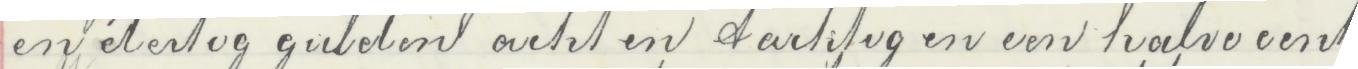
en dertig gulden acht en tachtig en een halve cent
